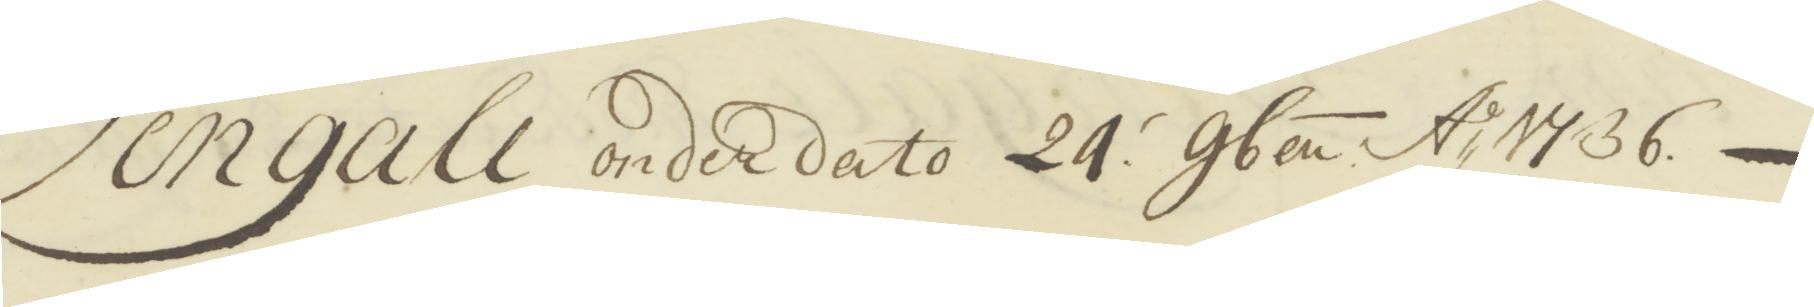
Van Bengale onder dato 24.' 9ber A„o 1736.
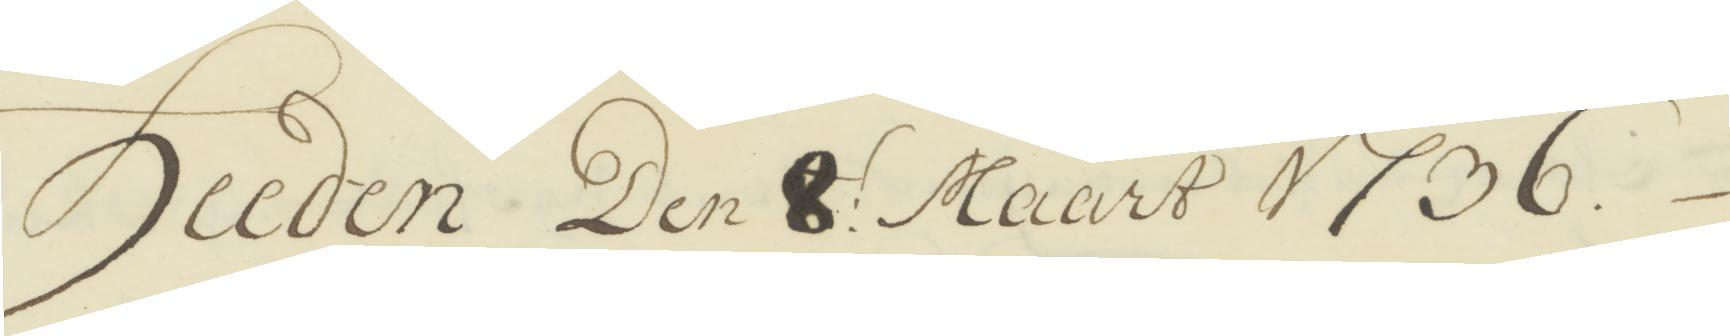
Heeden Den 8:' Maart 1736.
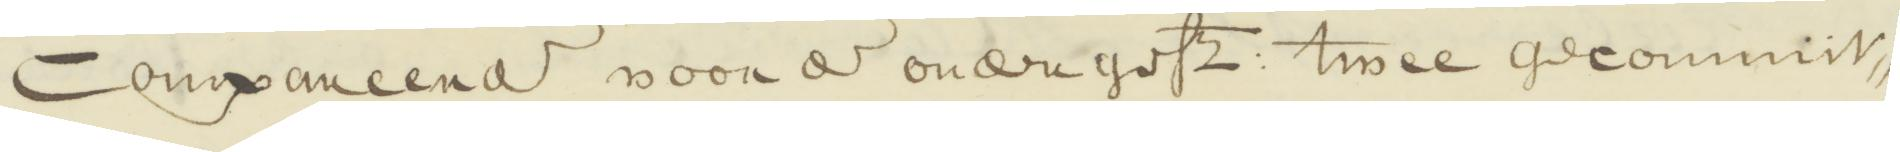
Compareerde voor de ondergesz: twee gecommit„
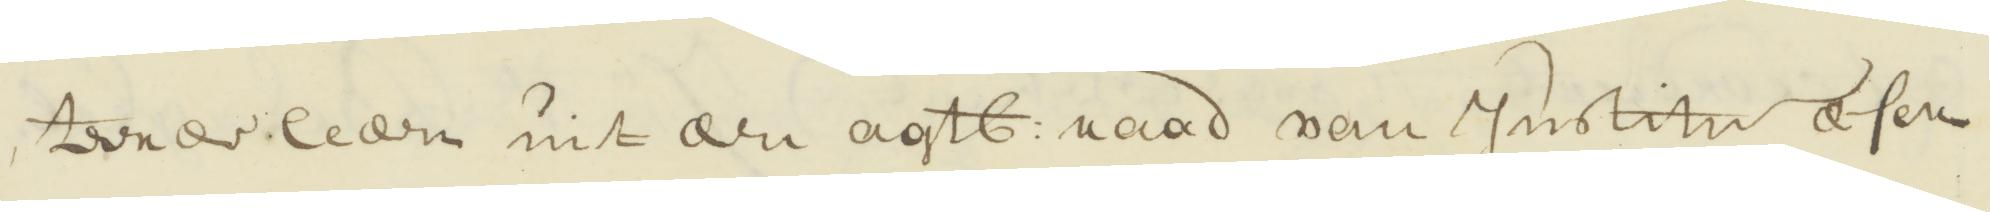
„teerde leden uit den agtb: raad van Justitie deser
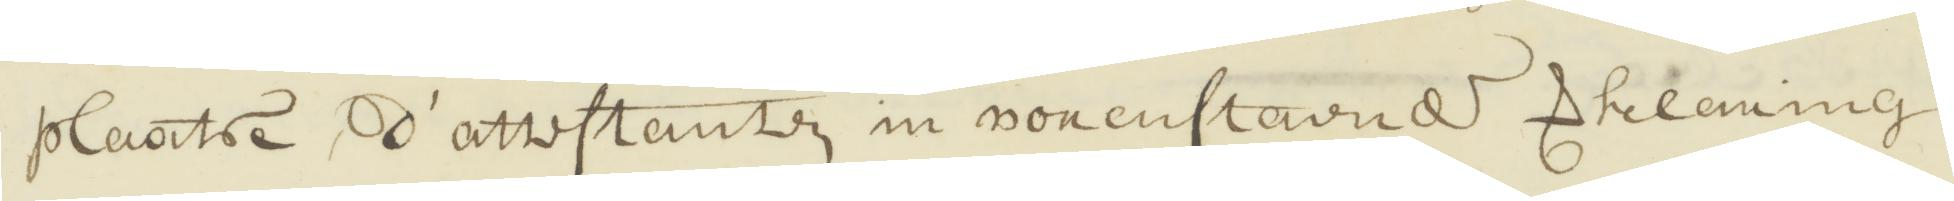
plaatse, d’attestanten in vorenstaende verklaring
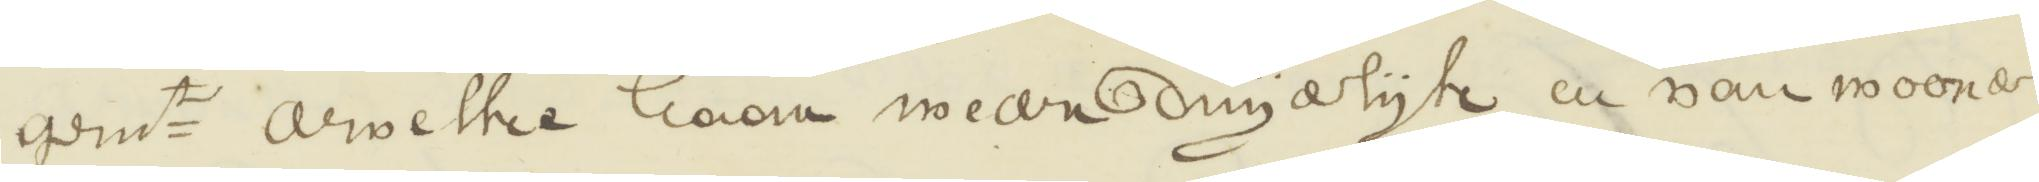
gem=t dewelke haar weder duijdelijk en van woorde
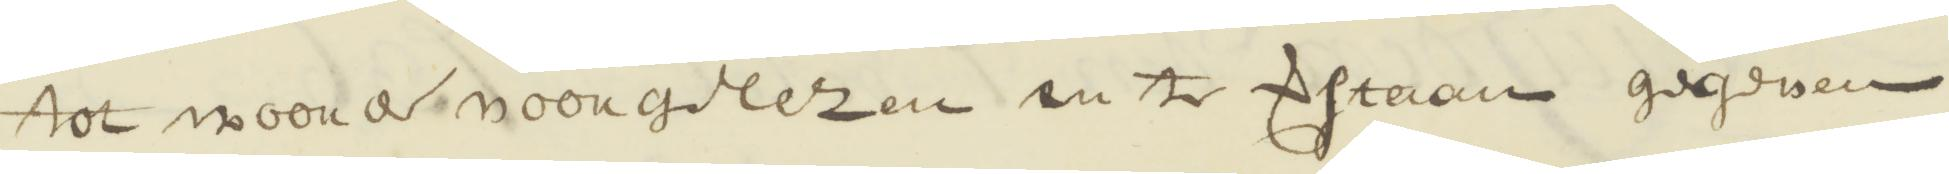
tot woorde voorgelezen en te verstaan gegeven
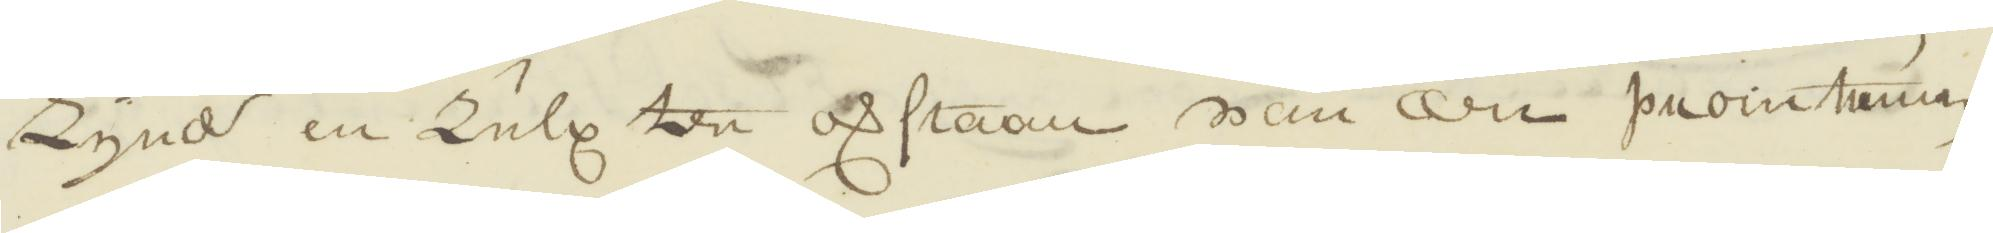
zijnde en zulx ten overstaan van den prointrum
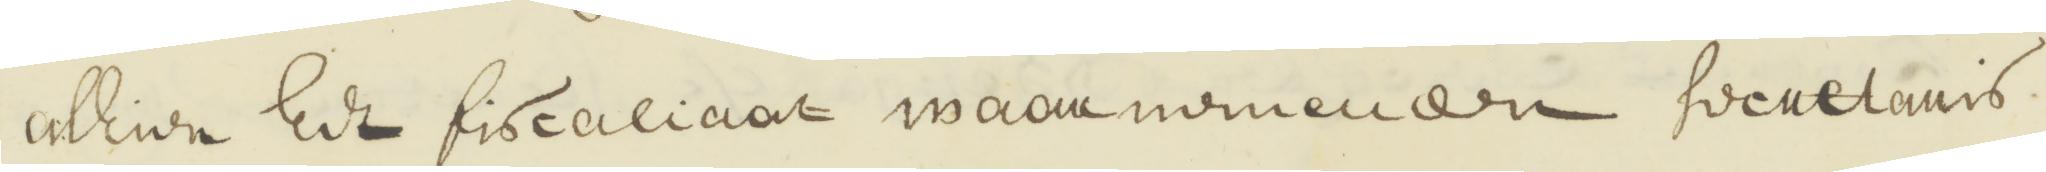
alhier het fiscaliaat waarnemen den secretaris
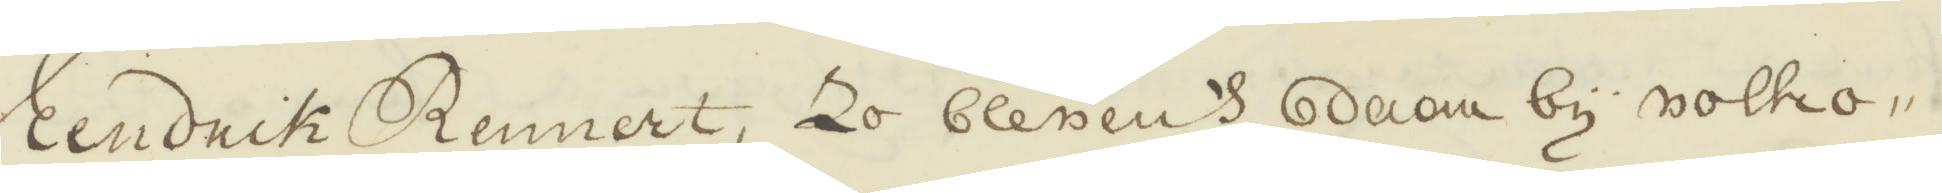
hendrik Rennert, zo bleven 's daar bij volko„
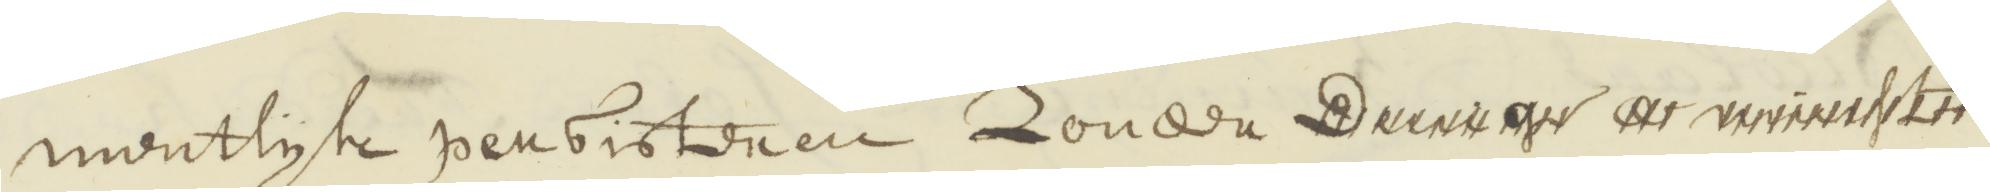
mentlijk persisteren zonder Eenige de minste
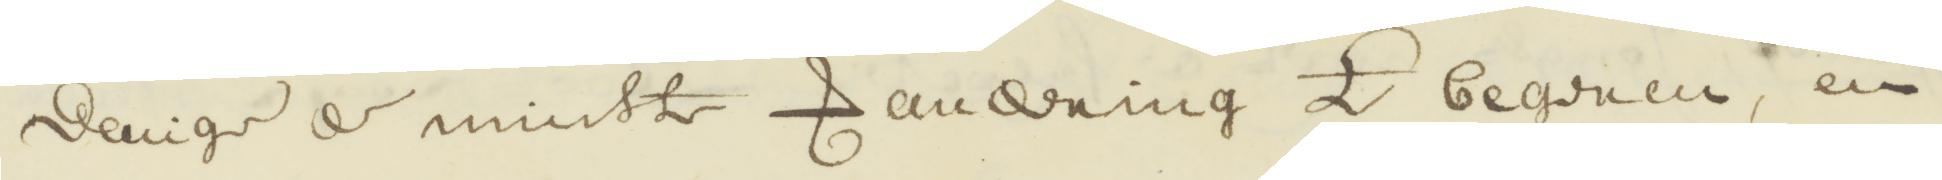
Eenige de minst verandering te begeren, en
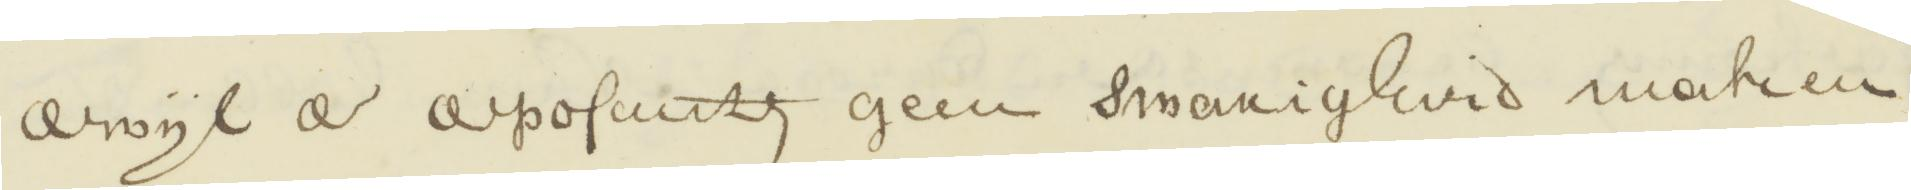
dewijl de deposanten geen swarigheid maken
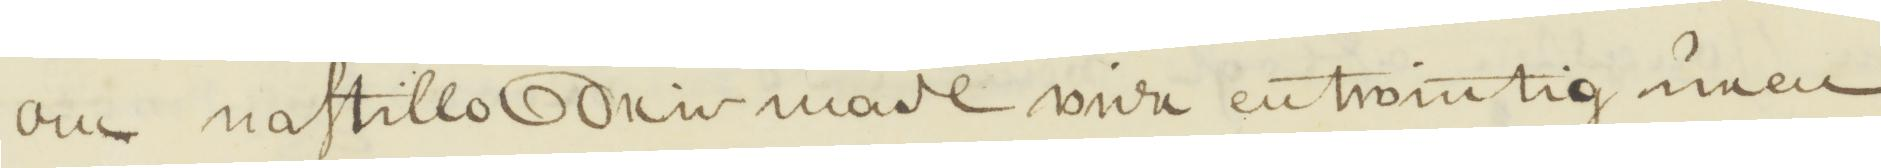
om nastillo drie mael vier en twintig uren
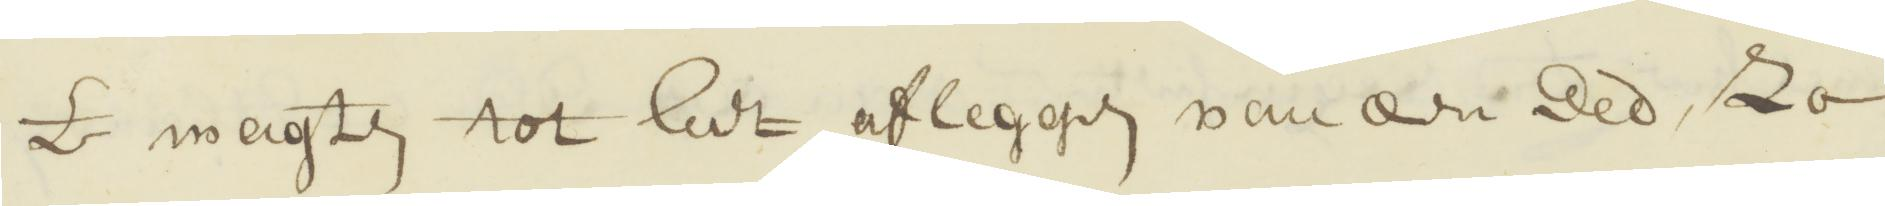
te wagten tot het afleggen van den Eed, zo
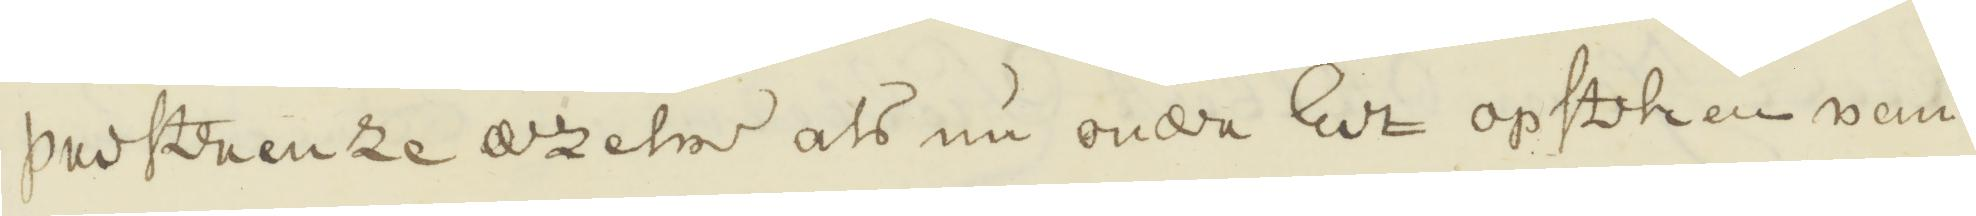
presteren ze dezelve als nu onder het opsteken van
